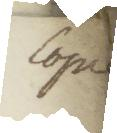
Copi
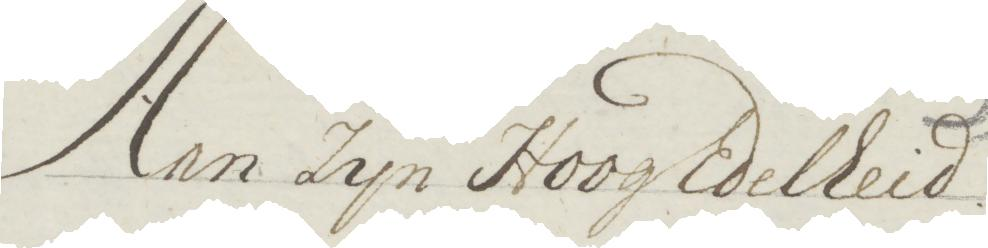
Aan Zyn Hoog Edelheid.
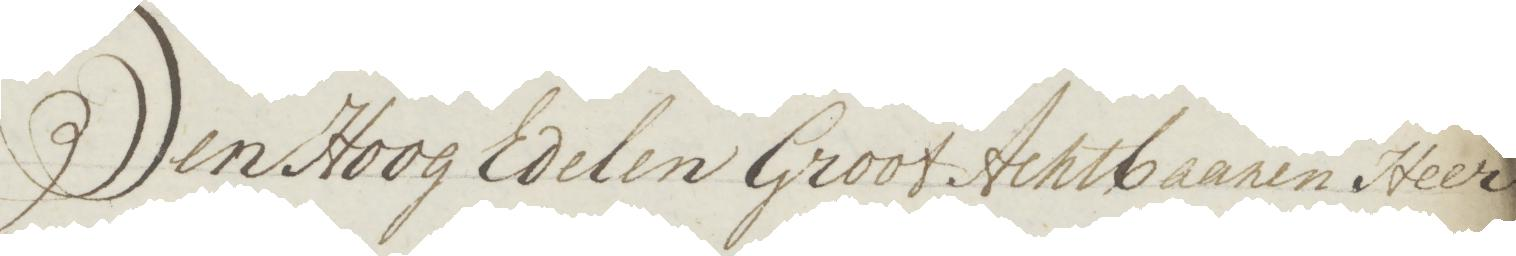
Den Hoog Edelen Groot Achtbaaren Heer
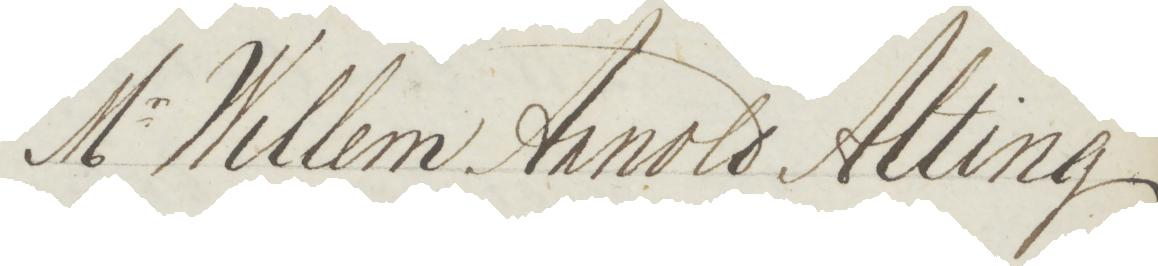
M=r Willem Arnold Alting
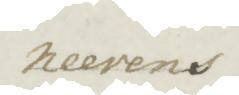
neevens
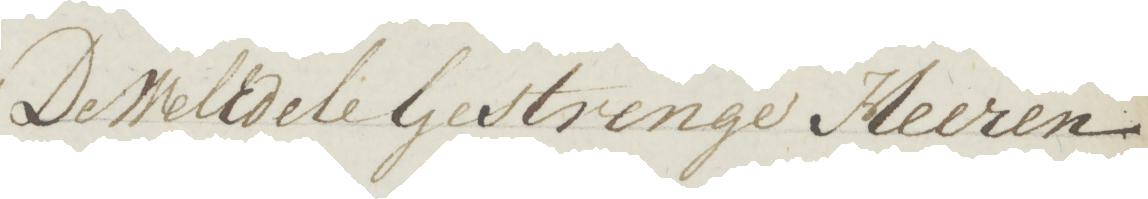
De WelEdele Gestrenge Heeren
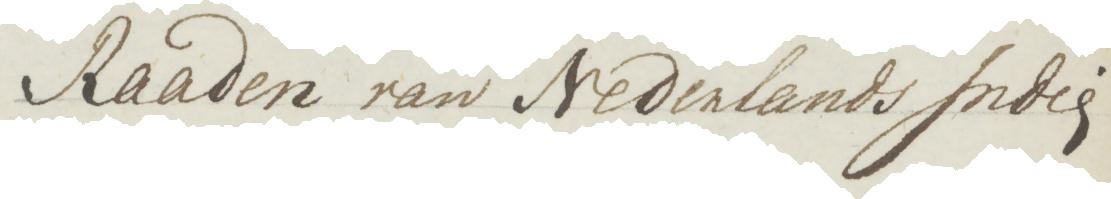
Raaden van Nederlands Jndië
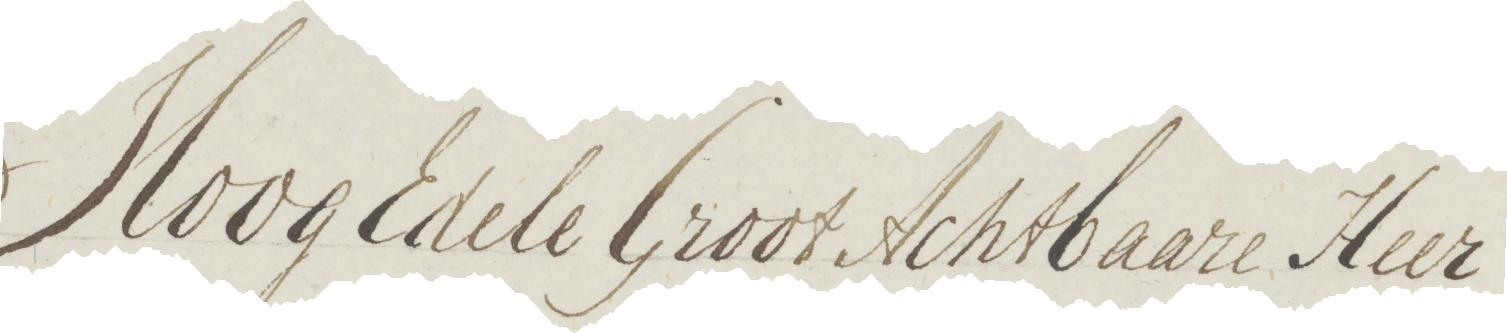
Hoog Edele Groot Achtbaare Heer
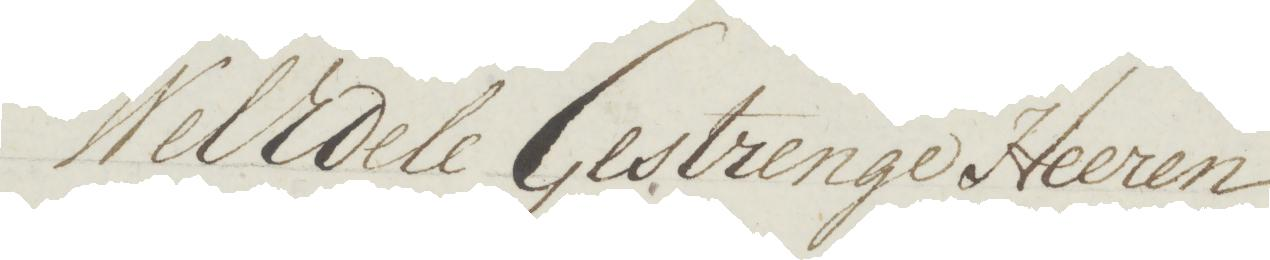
WelEdele Gestrenge Heeren
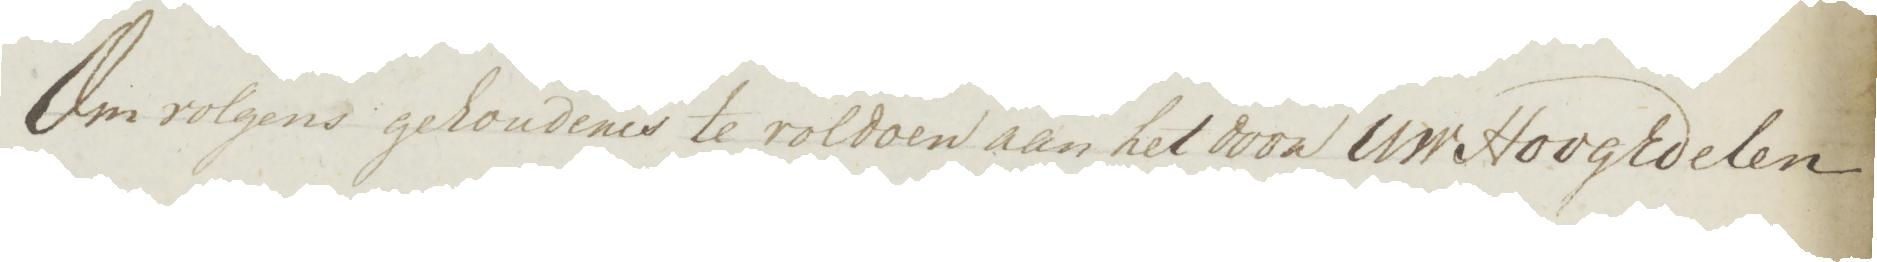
Om volgens gehoudenis te voldoen aan het door Uw HoogEdelen
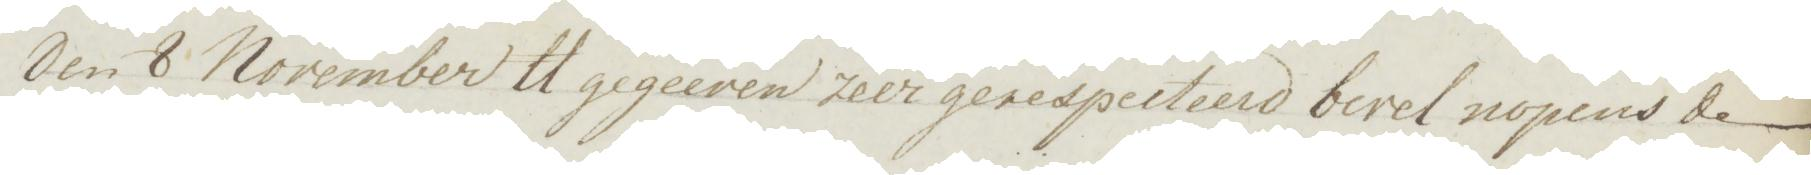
den 8 November lt gegeeven zeer gerespecteerd bevel nopens den
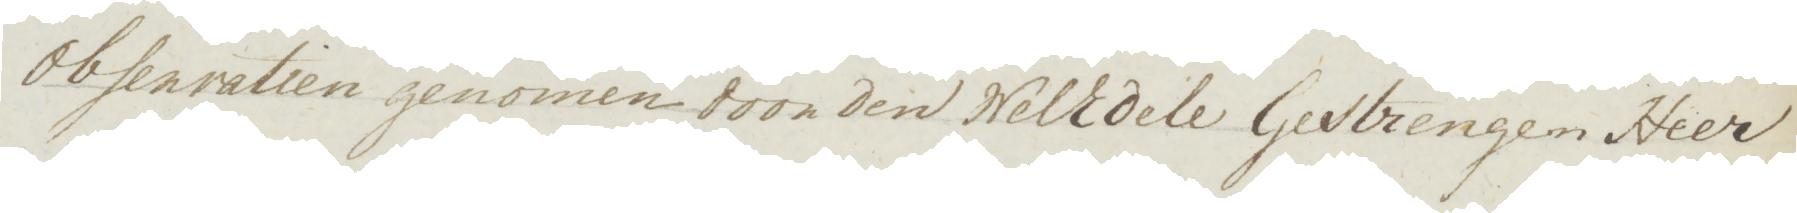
observatien genomen door den WelEdele Gestrengen Heer
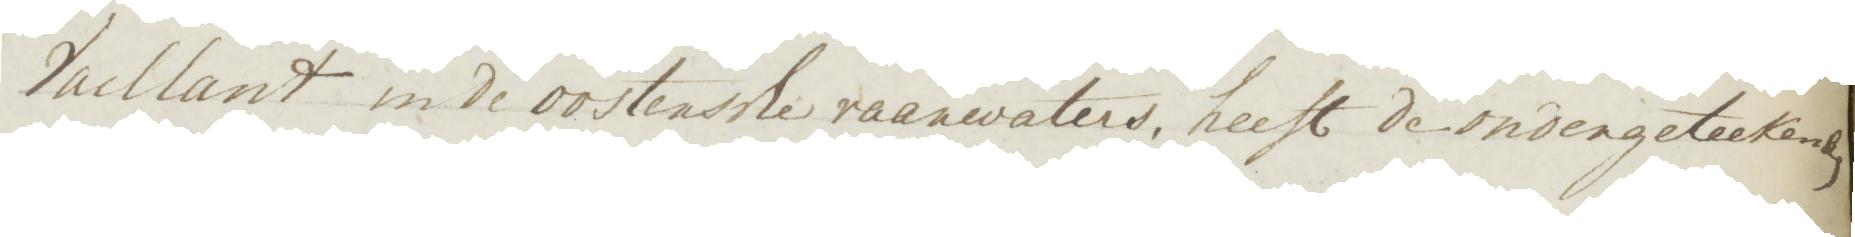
Vaillant in de oostersche vaarwaters, heeft de ondergeteekenden
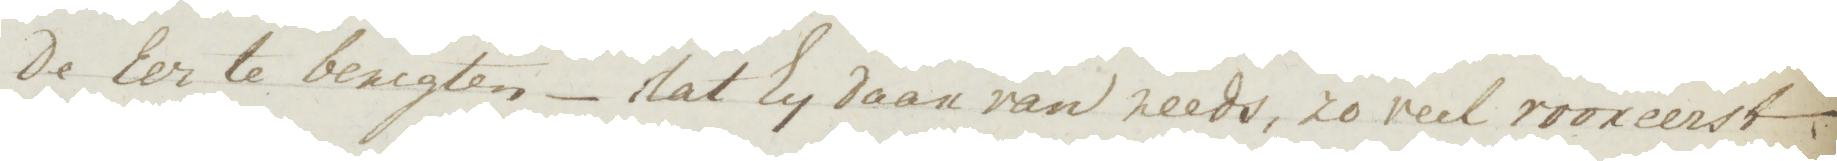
de Eer te berigten — dat hij daar van reeds, zo veel vooreerst,
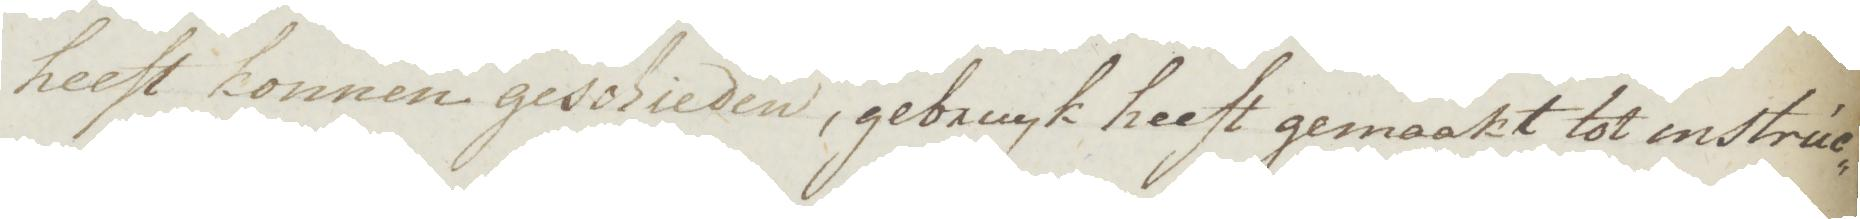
heeft konnen geschieden, gebruyk heeft gemaakt tot instruc„
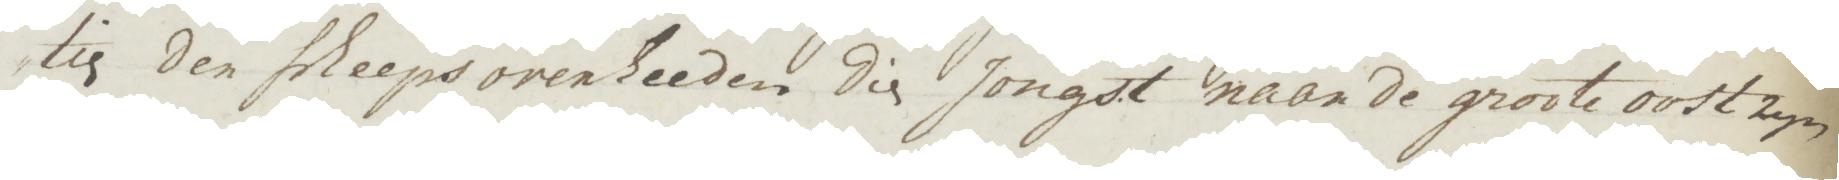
„tie den scheepsoverheeden die jongst naar de groote oost zyn
